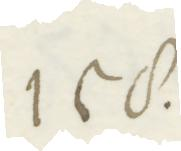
158.
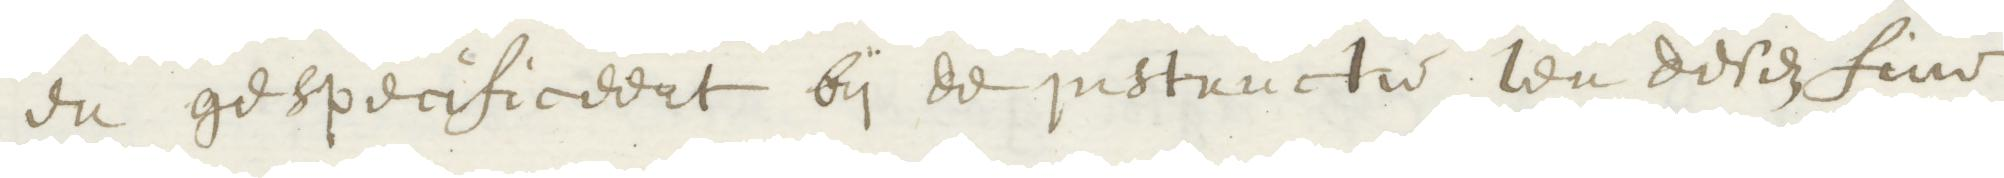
en gespecificeert bij de instructie ten desen sine
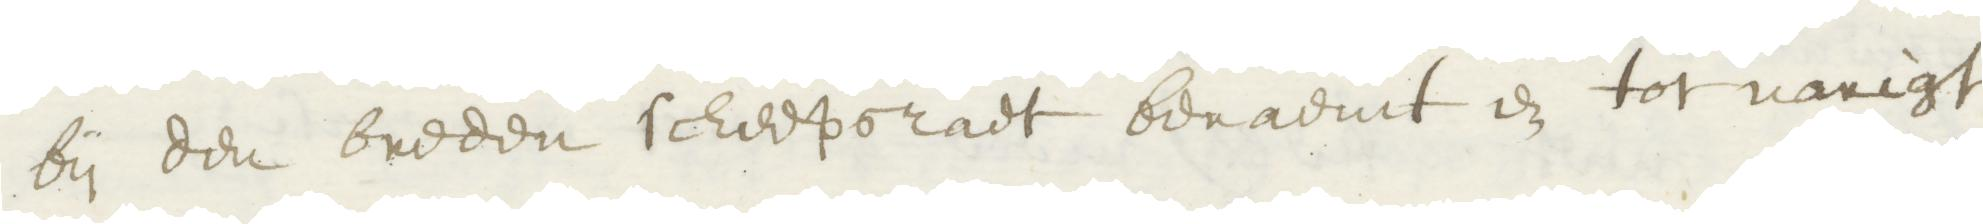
bij den breden scheepsraet beraemt en tot narigt
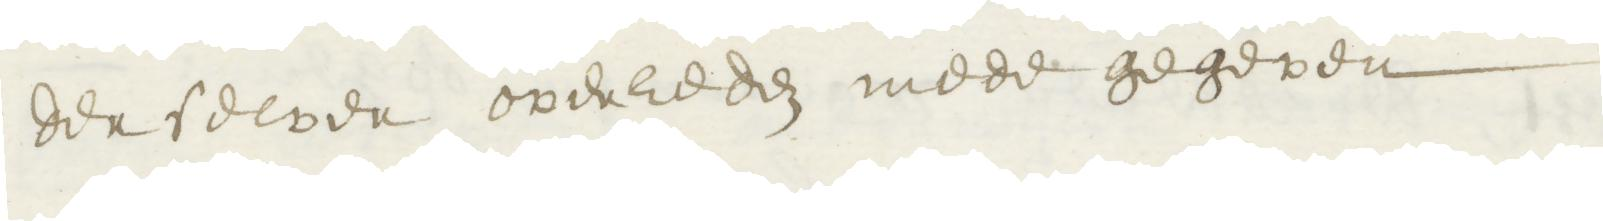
derselver overheden mede gegeven.
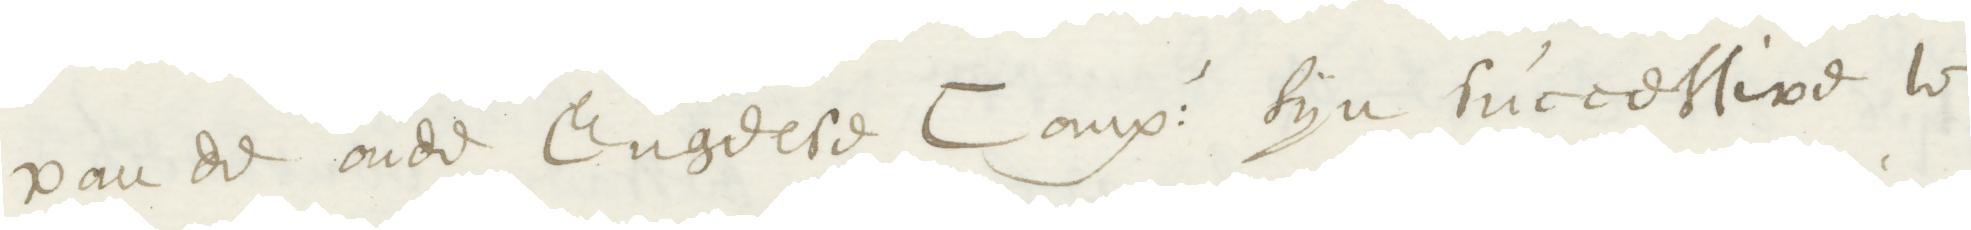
van de oude Engelse Comp:s sijn successive te
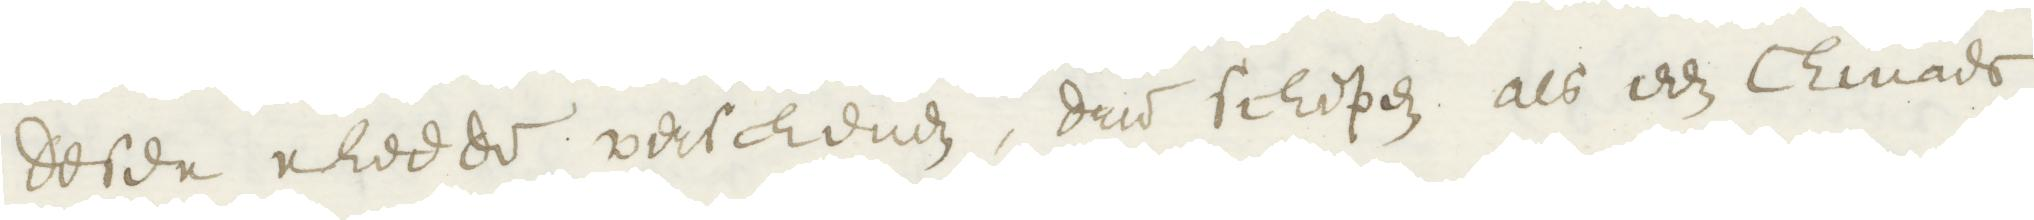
deser rheede verschenen, drie schepen als een Chinaes
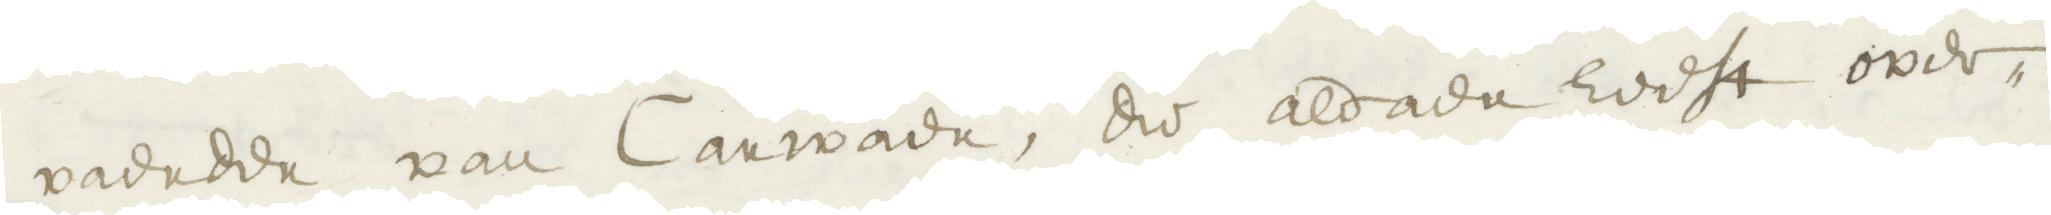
vaerder van Carwaer, die aldaer heeft over„
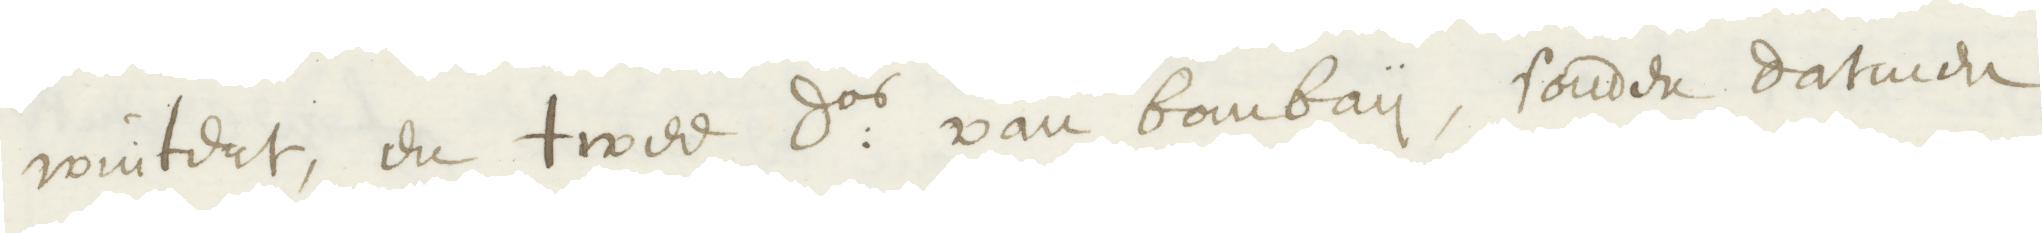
wintert, en twee d:os van bombaij, sonder dat men
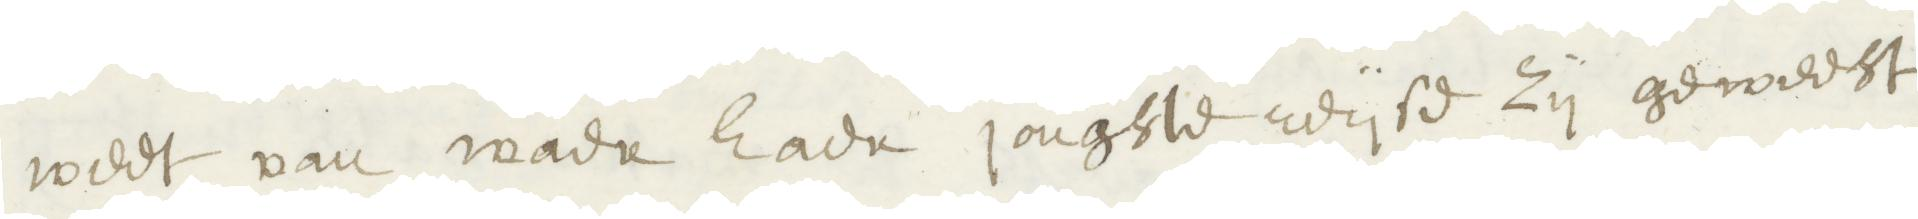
weet van waer haer jongste reijse zij geweest
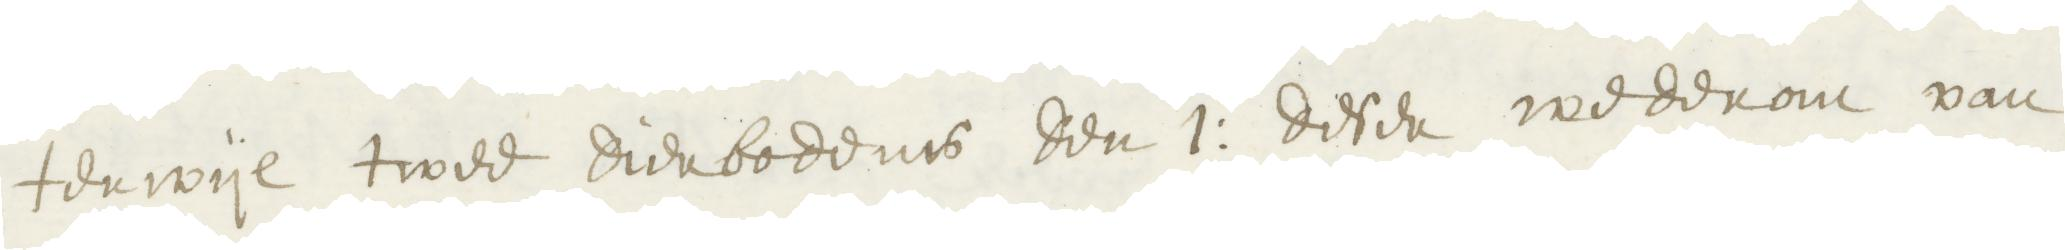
terwijl twee dier bodems den 1: deser wederom van
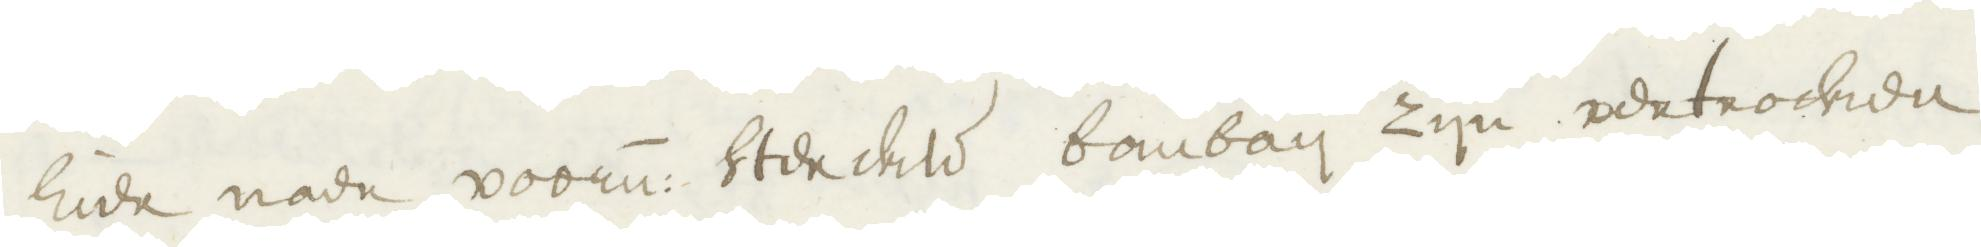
hier naer voorn: sterckte bombaij zijn vertrocken
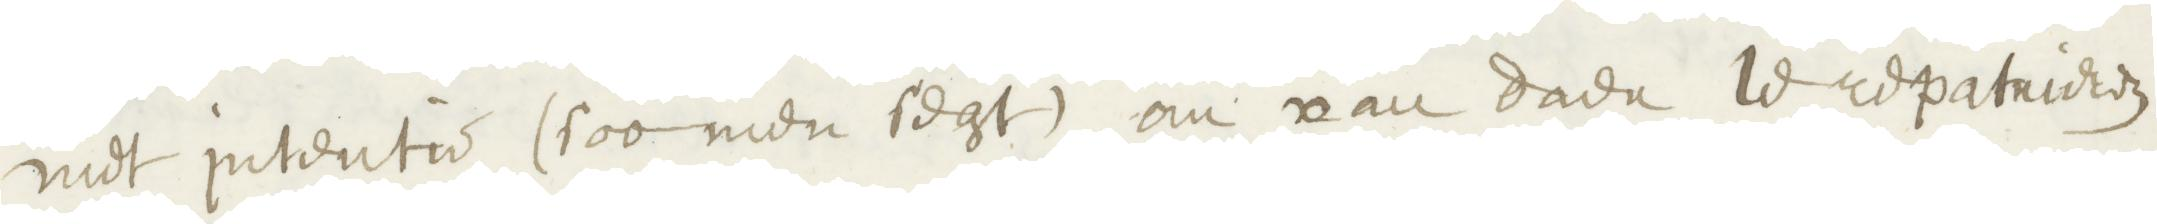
met intentie (soo men segt) om van daer te repatrieren
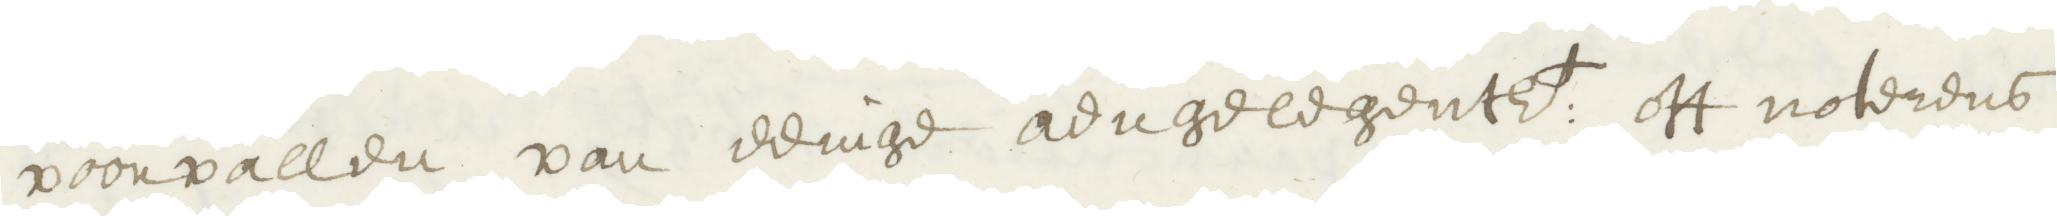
voorvallen van eenige aengelegenth:t off noterens
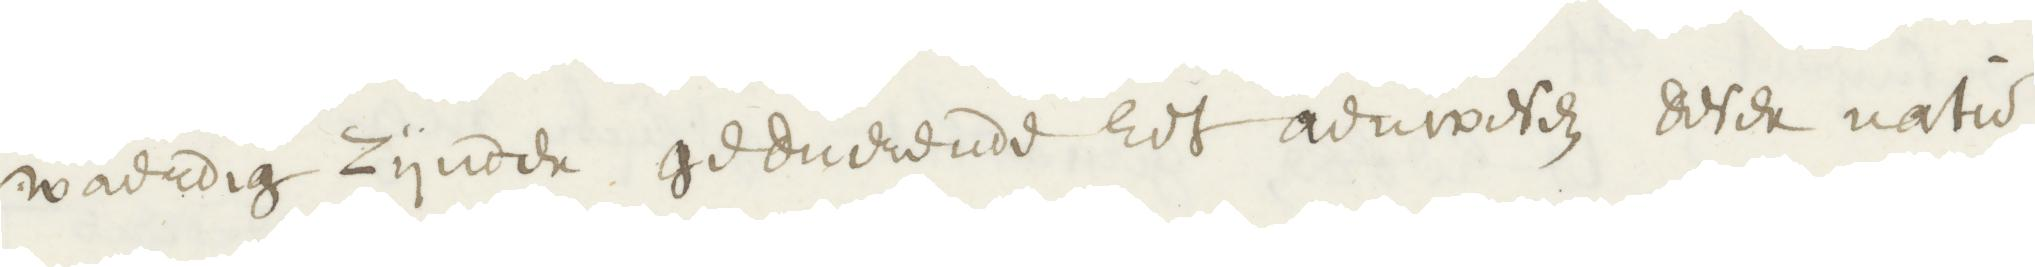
waerdig zijnder geduerende het aenwesen deser natie
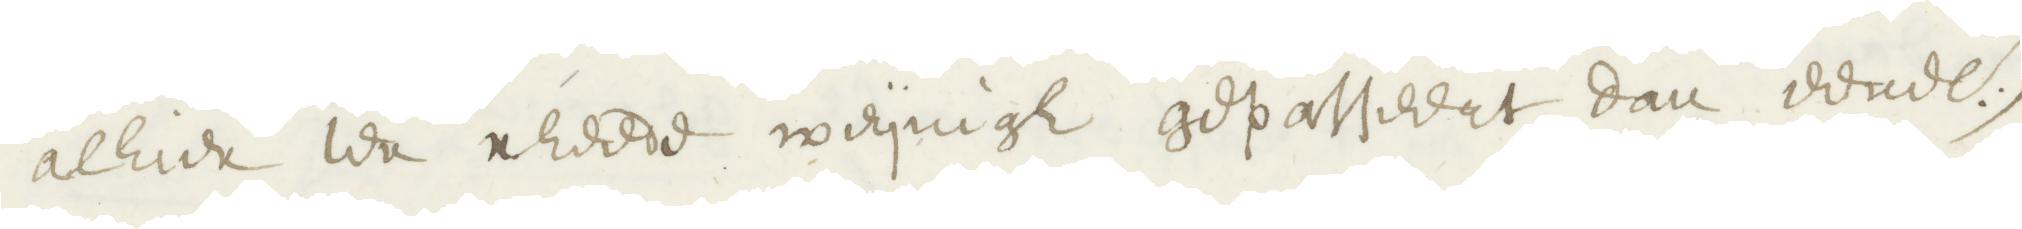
alhier ter rheede weijnigh gepasseert dan eenelijk:
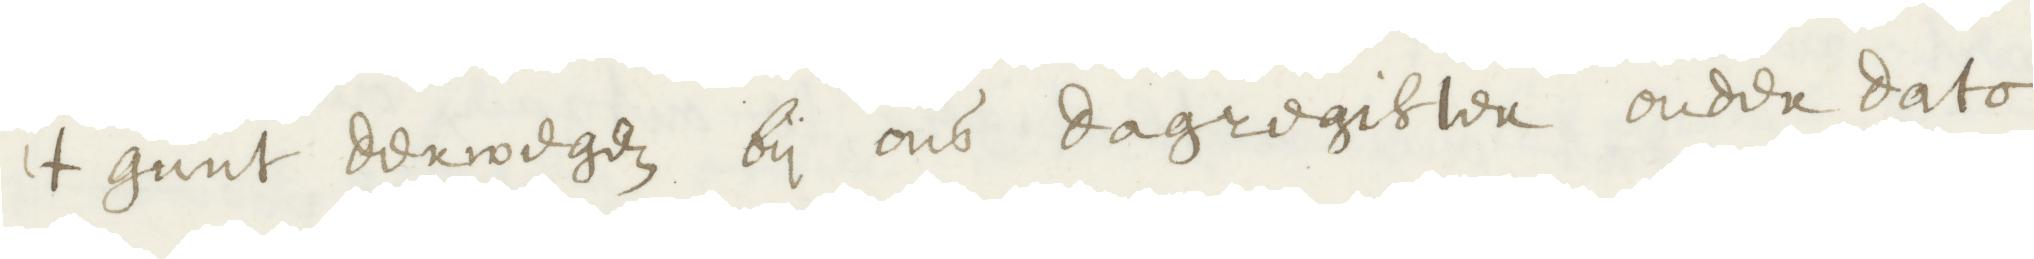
’t gunt derwegen bij ons dagregister onder dato
